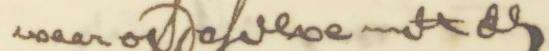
waar over deselve met den
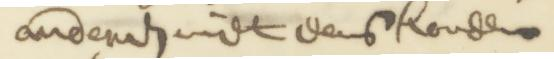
anderen niet eens konden
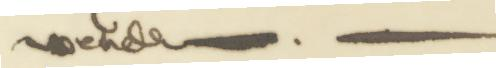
werden.—
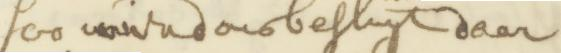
soo wierd ons besluijt daar
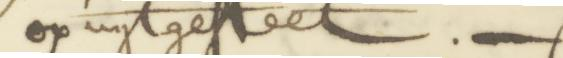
op uijtgestelt.—
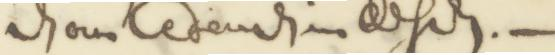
en om redenen desen. —
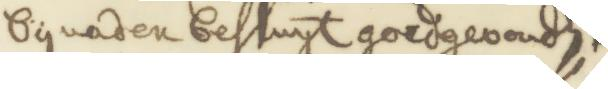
bij nader besluijt goed gevonden,
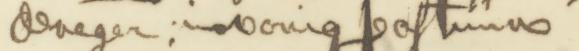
de regen: in vorig postuur
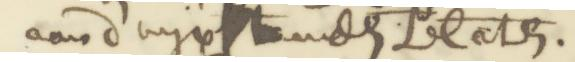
aan d’ rijxstanden te laten.
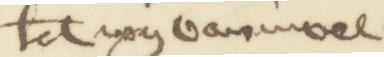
tot wij van uwel
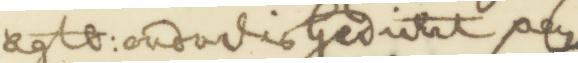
agtb: ordre is gedickt aen
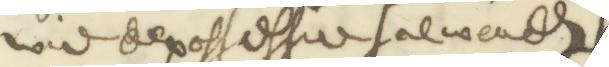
wie de possessie Sal werden
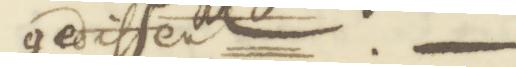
gediffer=t.
